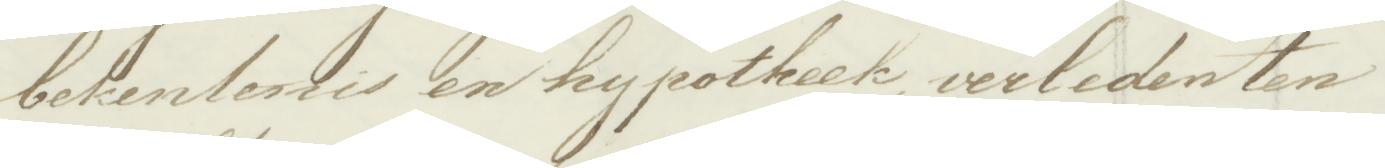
bekentenis en hypotheek, verleden ten
